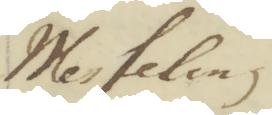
Wesseling
